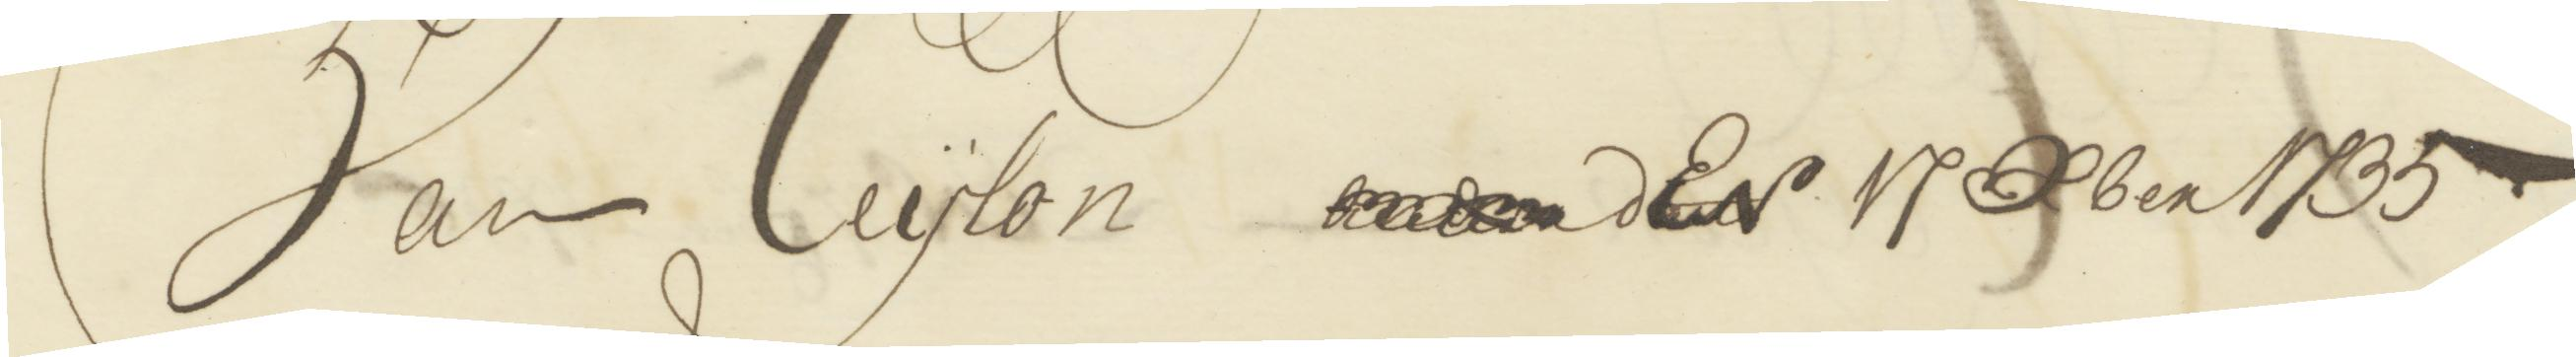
Van Ceijlon aden den 17 Xber 1735.
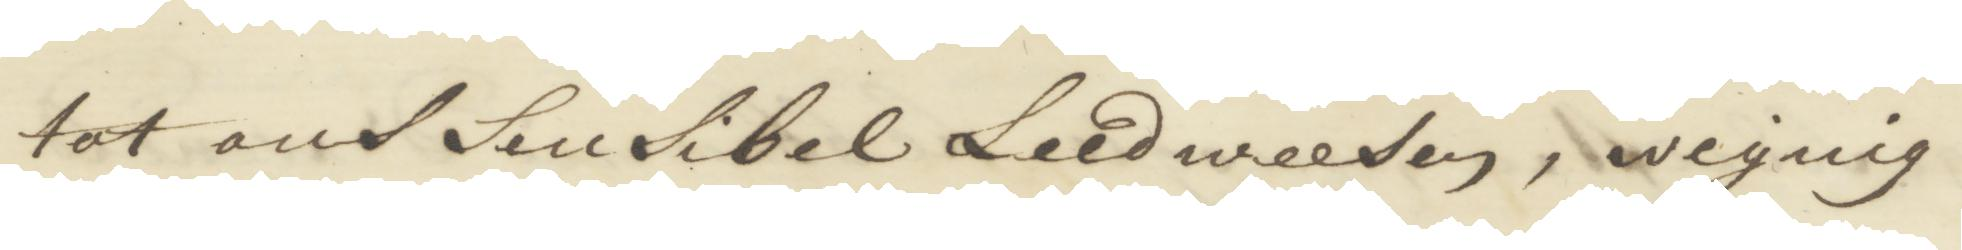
tot ons Sensibel Leedweesen, weijnig
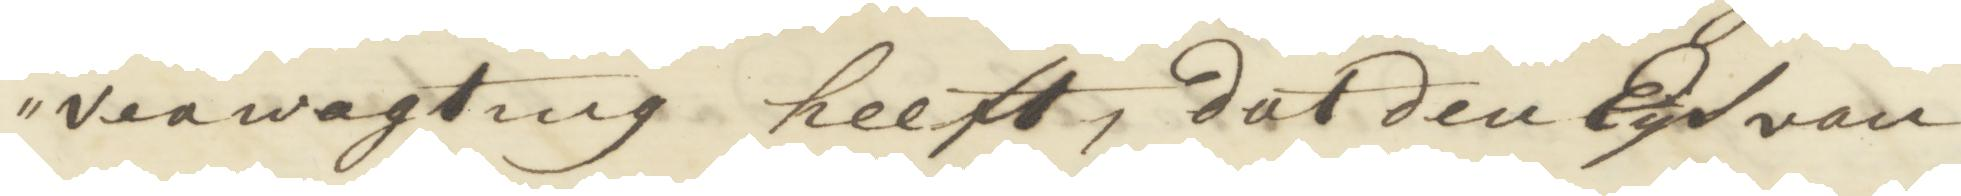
„verwagting heeft, dat den Eijs van
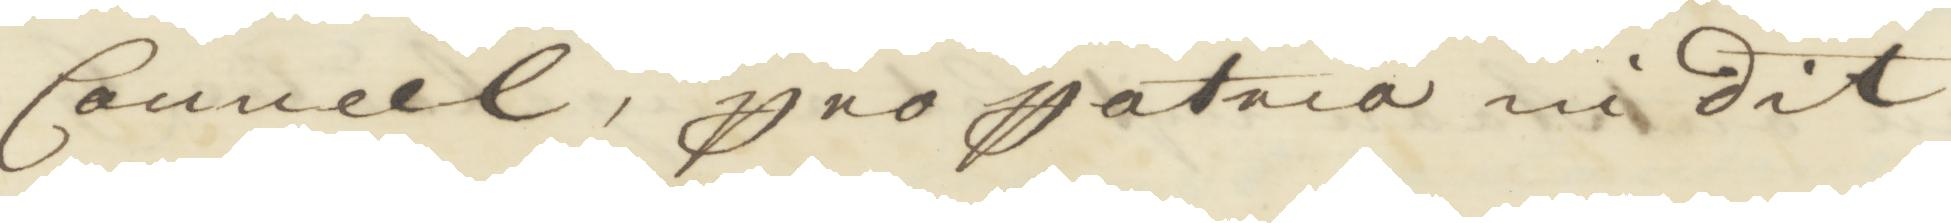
Canneel, pro patria in dit
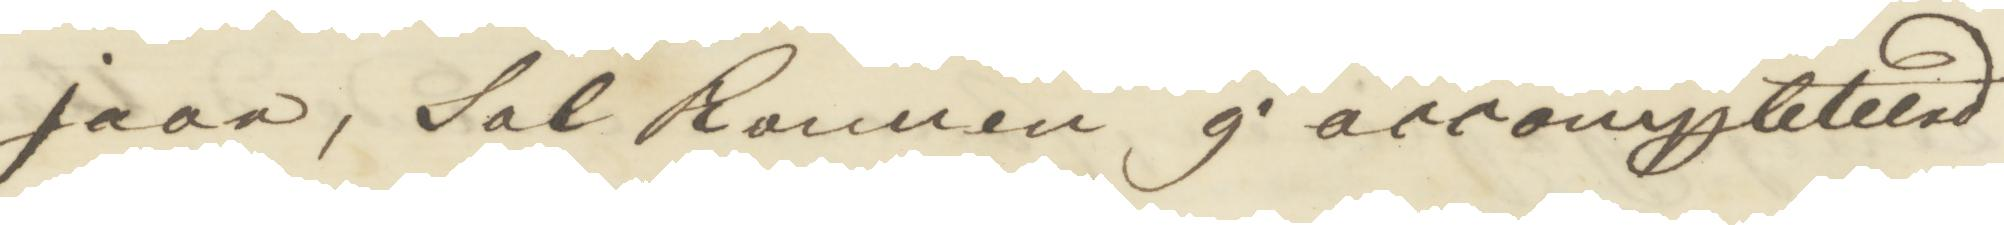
jaar, Sal konnen g’accompleteerd
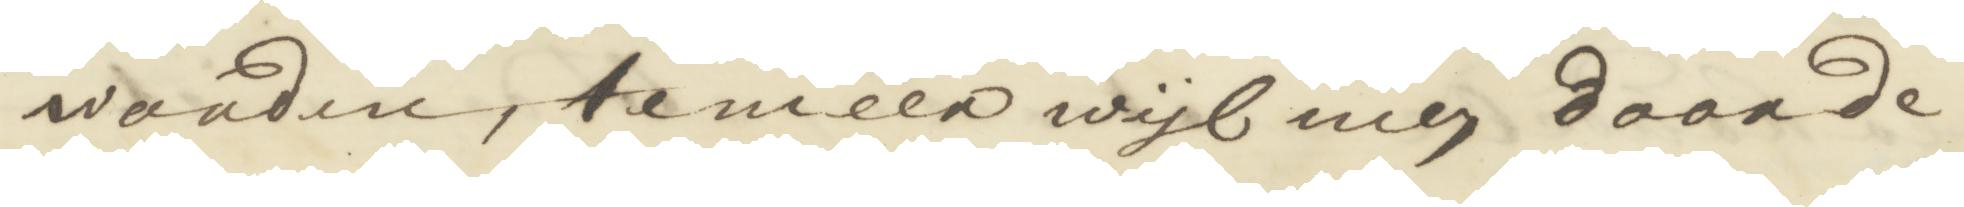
worden, te meer wijl men door de
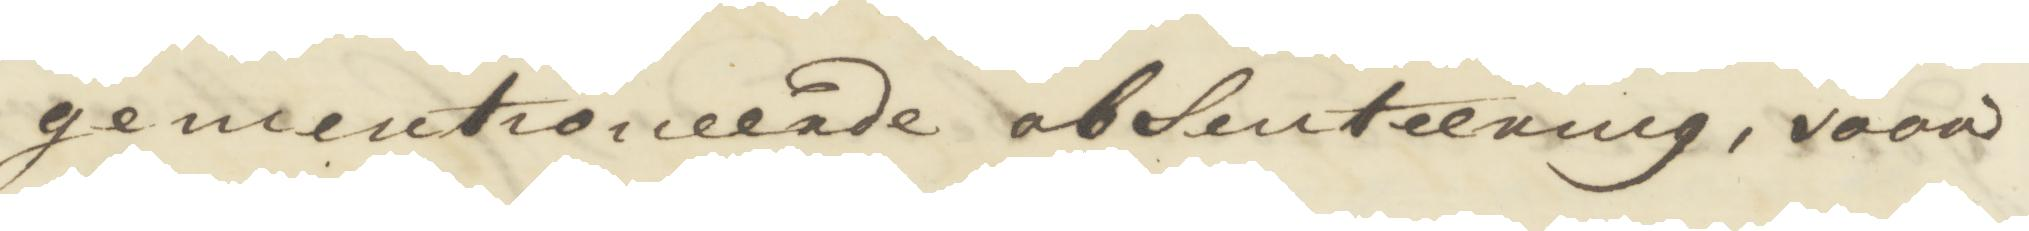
gementioneerde absenteering, voor
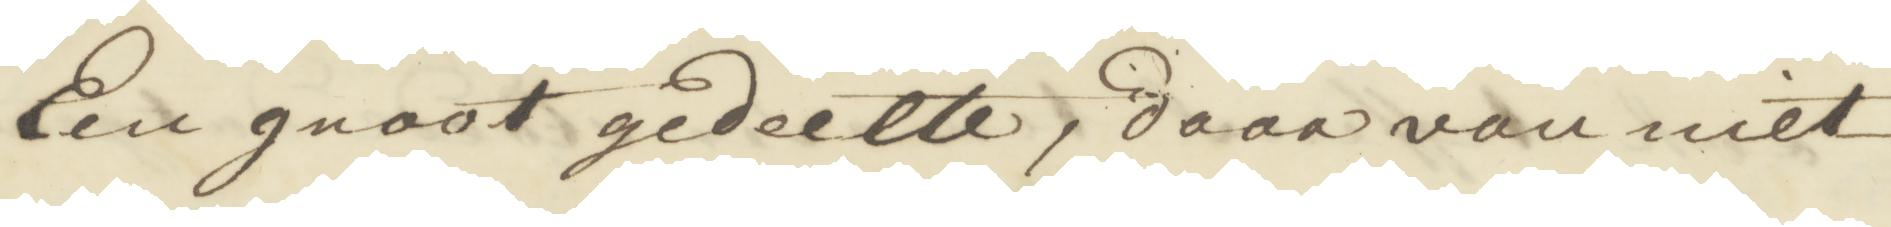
Een groot gedeelte, daar van niet
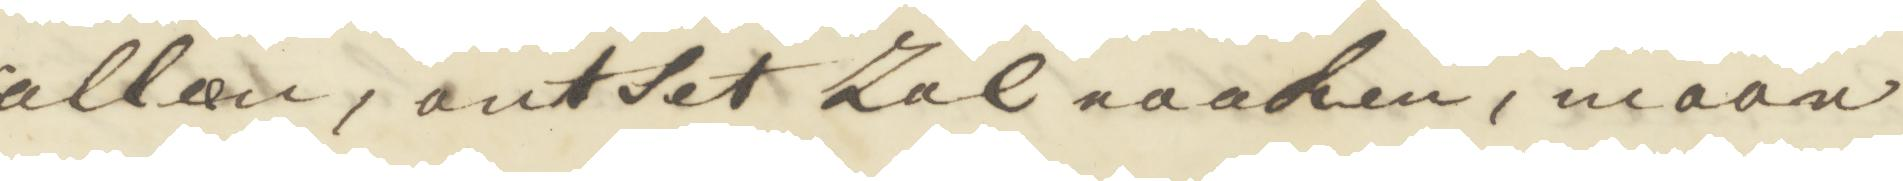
alleen, ontset Zal raaken, maar
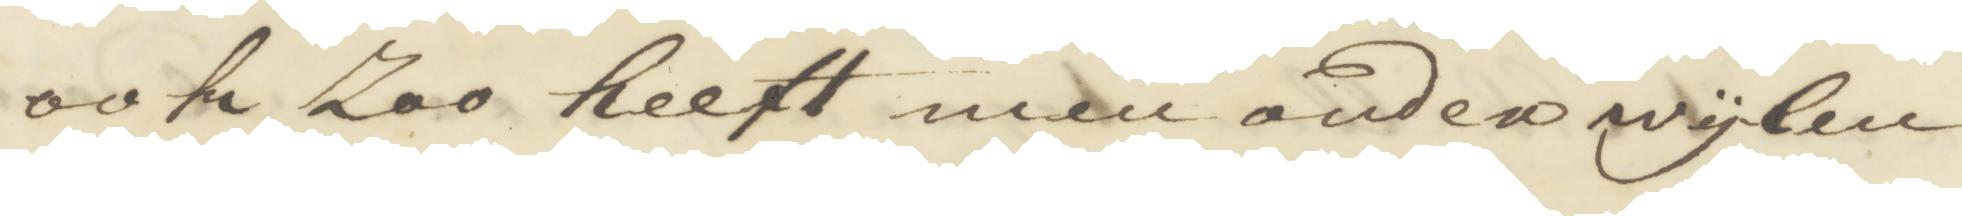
ook Zoo heeft men onder wijlen
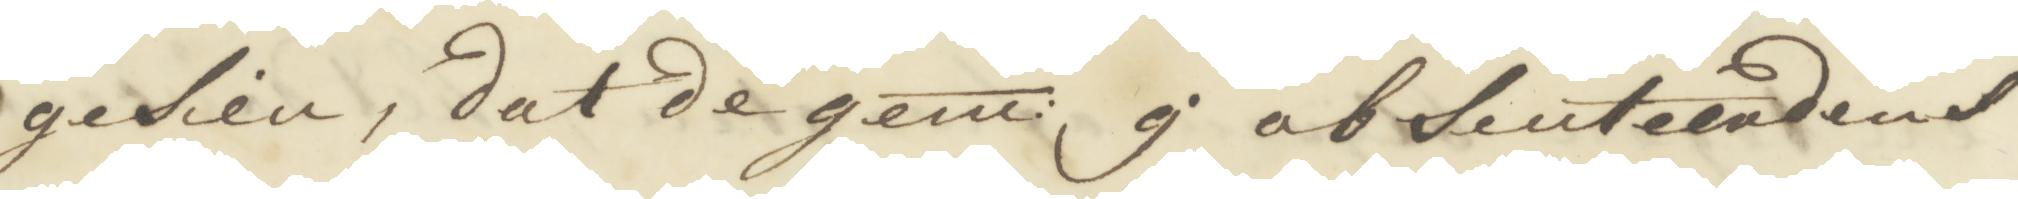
gesien, dat de gem: g’absenteerdens
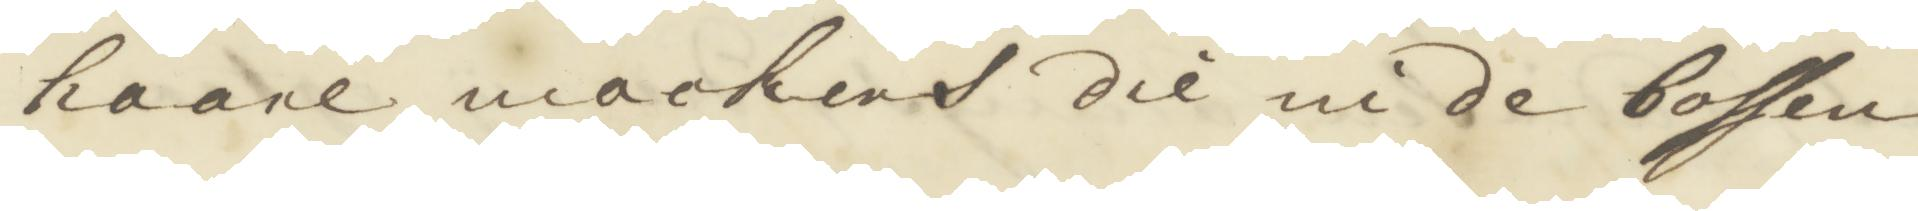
haare mackers die in de bossen
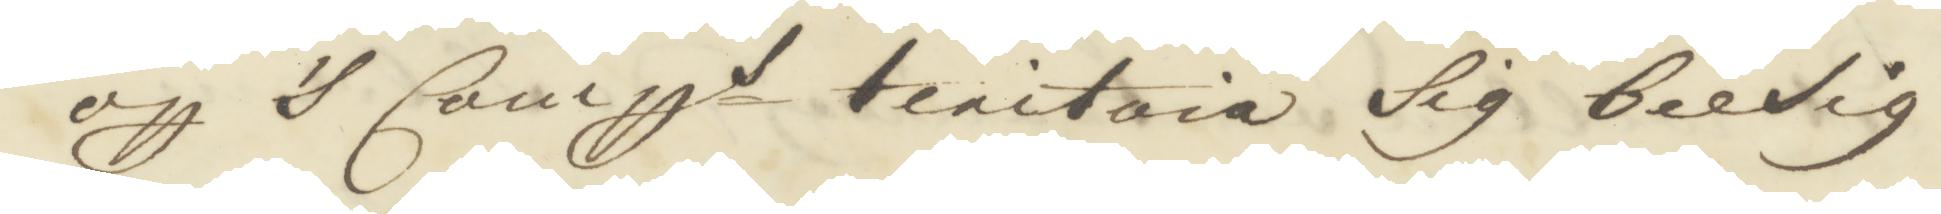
op ’S Comp=s terioir Sig beesig
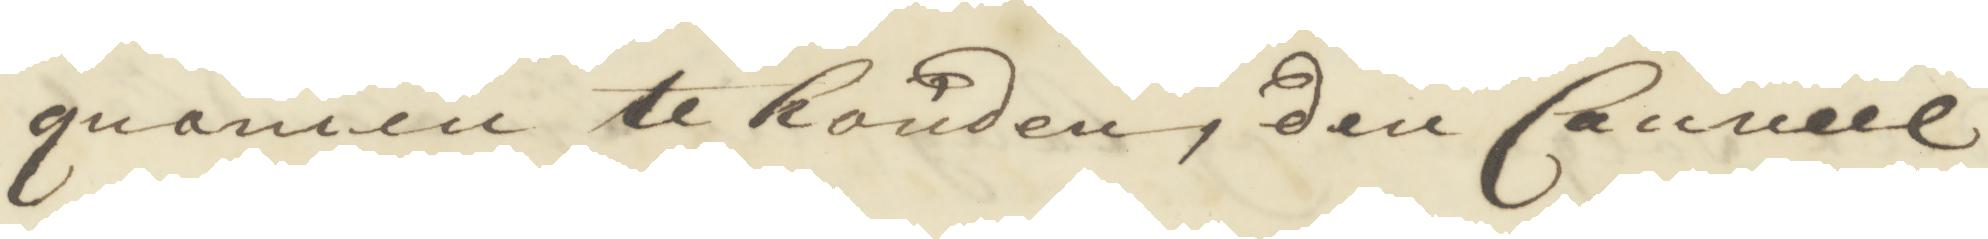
quamen te houden, den Canneel
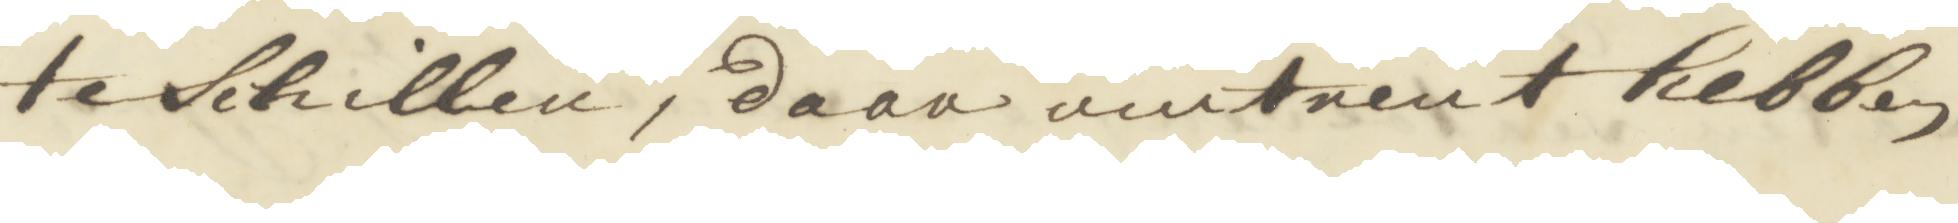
te Schillen, daar omtrent hebben
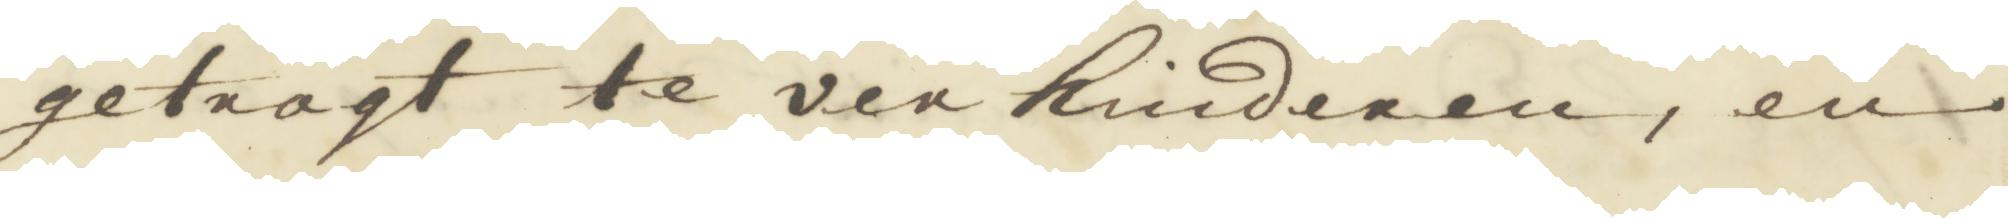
getragt te verhinderen, en
